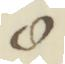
,, 8
